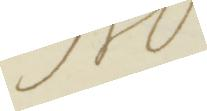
310
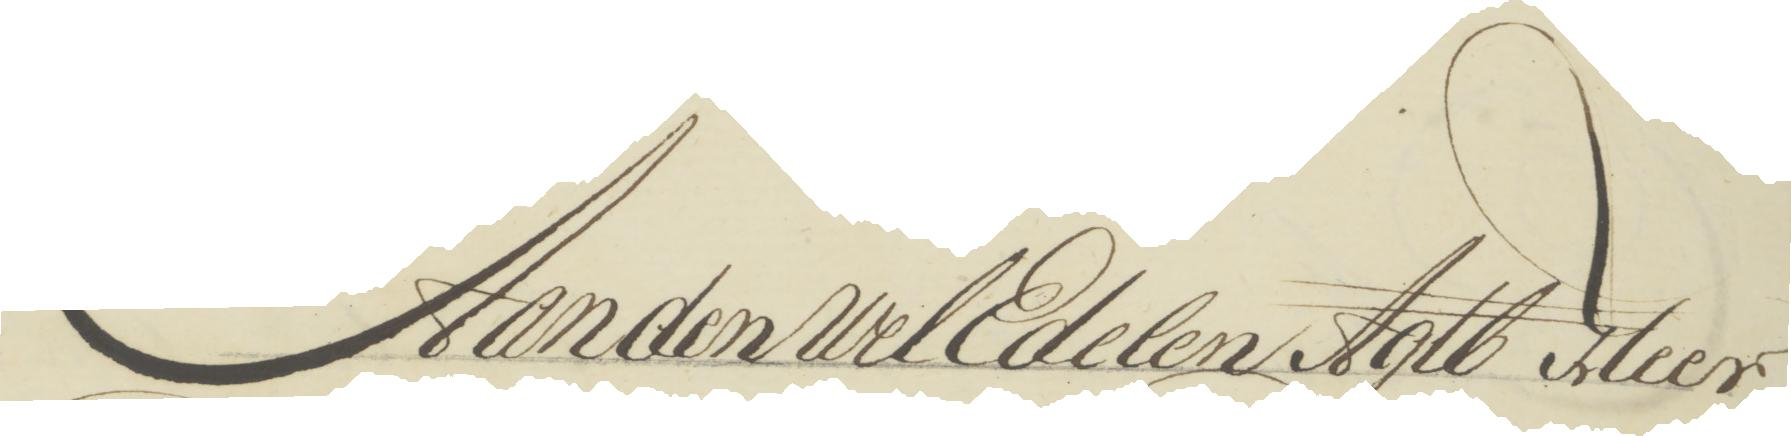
Aandenwel Edelen Agtb Heer
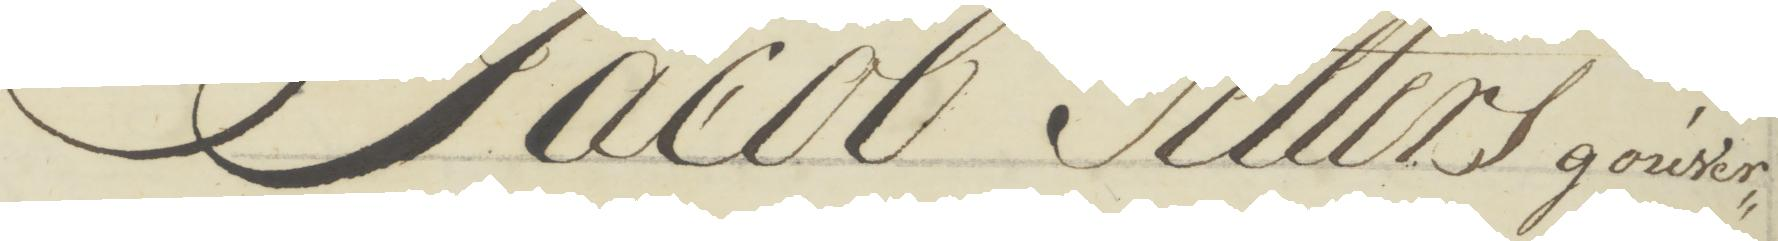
Jacob Petters gouver„
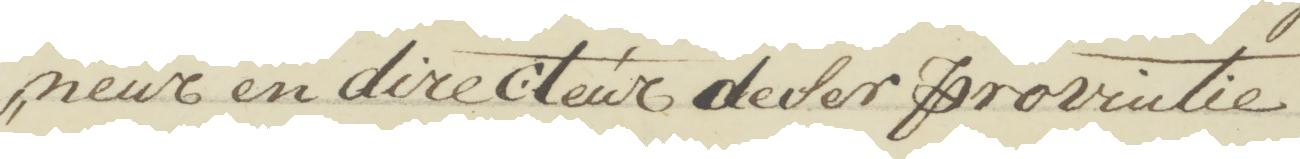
„neur en directeur deser provintie
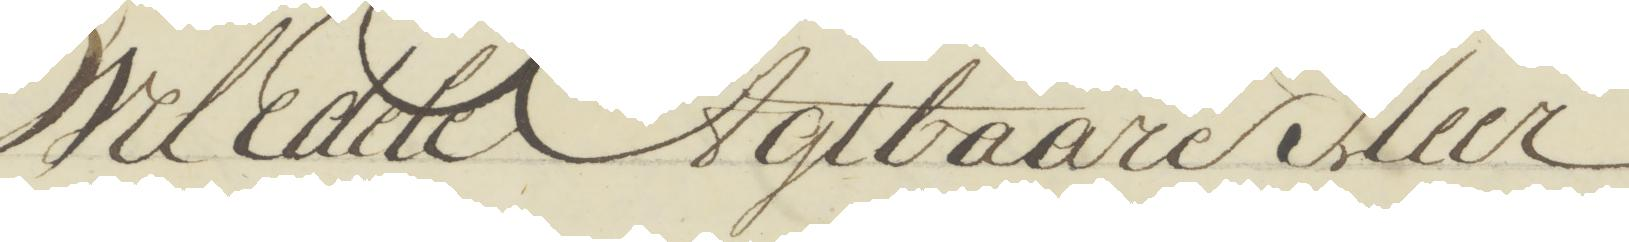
Wel Edele Agtbaare Heer
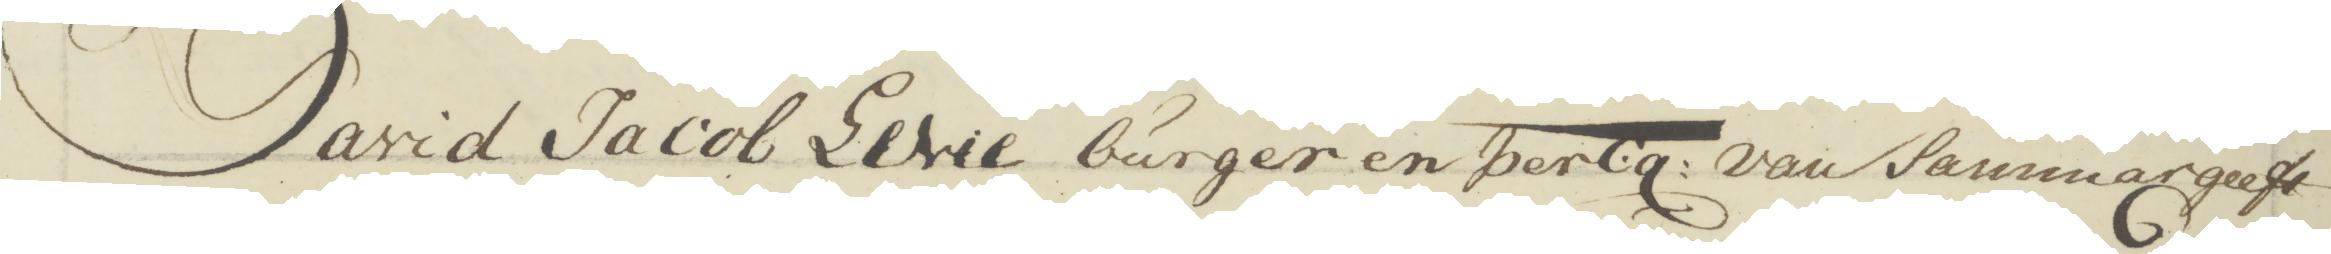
David Iacob Levie burger en percq: van sammargeeft
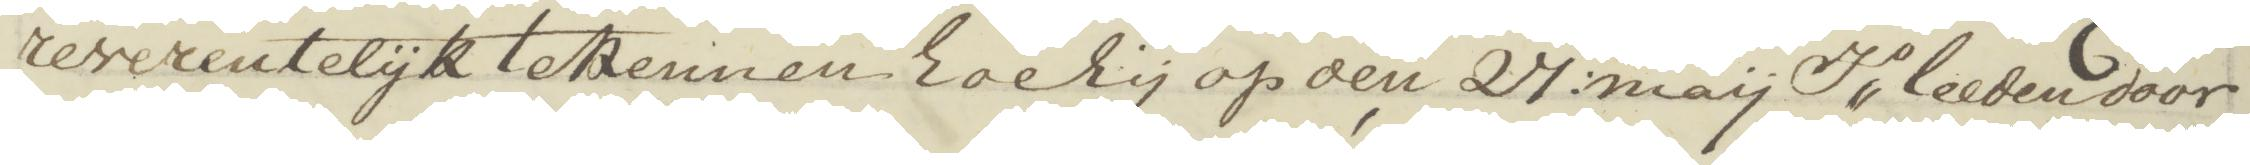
reverentelijk tekennen hoe hij op den 27:en maij I„o leeden door
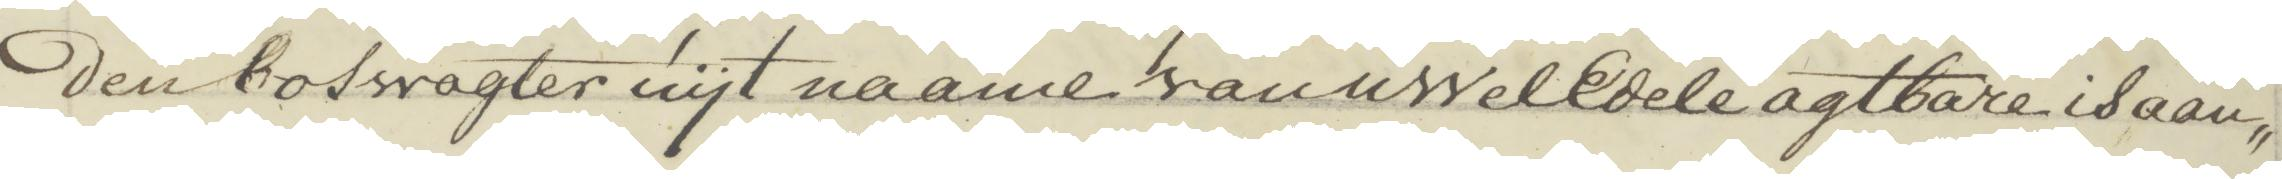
den boswagter uijt naame van uWelEdele agtbare is aan„
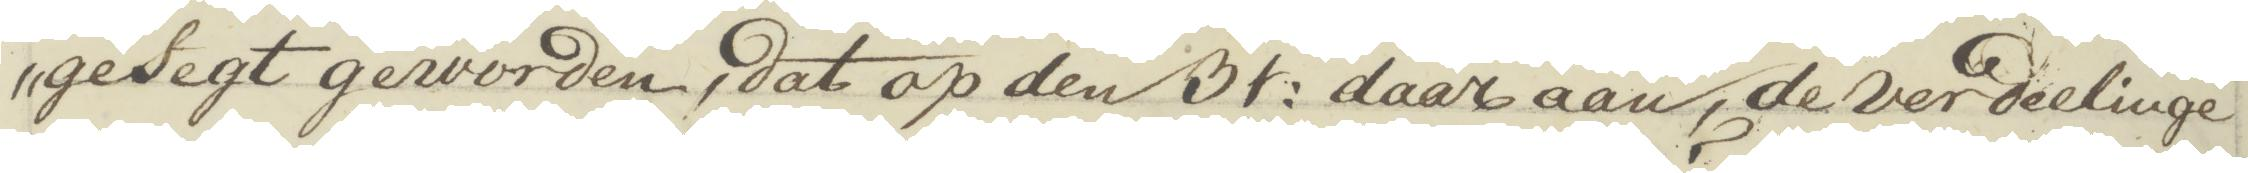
„gesegt geworden, dat op den 31: daar aan, de verdeelinge
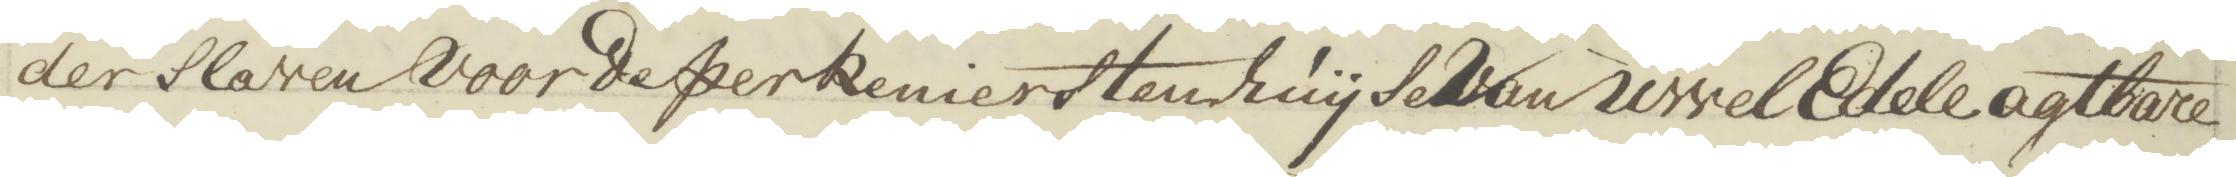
der slaven voor de perkeniers ten huijse van uwel Edele agtbare
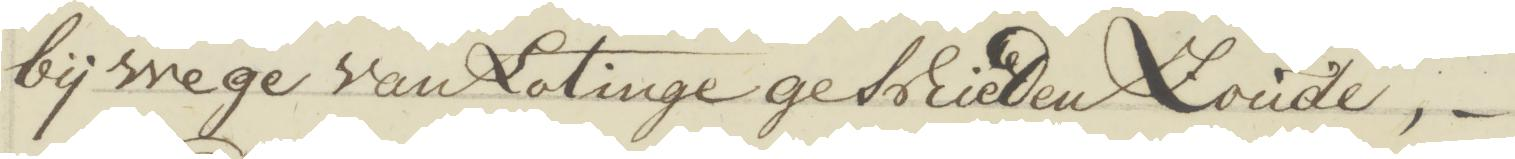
bij wege van Lotinge geschieden Zoude, —
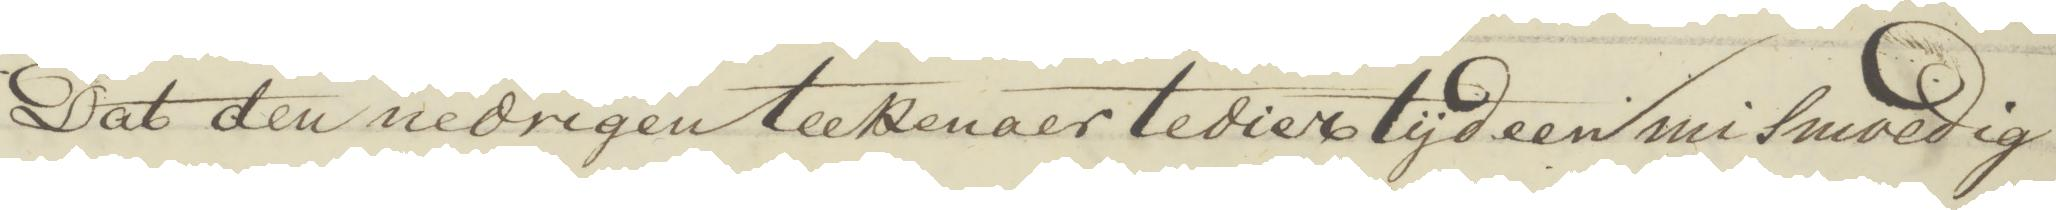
Dat den nedrigen teekenaer tedier tijd een mismoedig
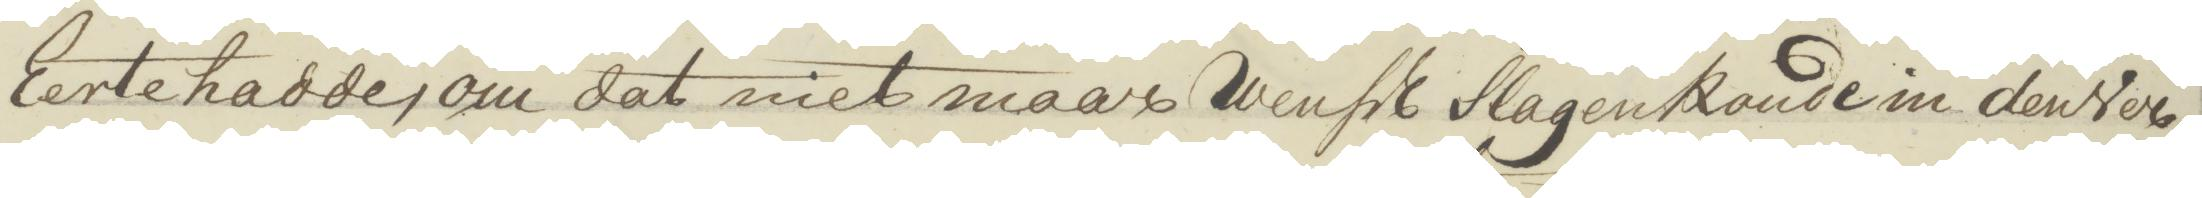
herte hadde, om dat niet maar wensch slagen konde in denver
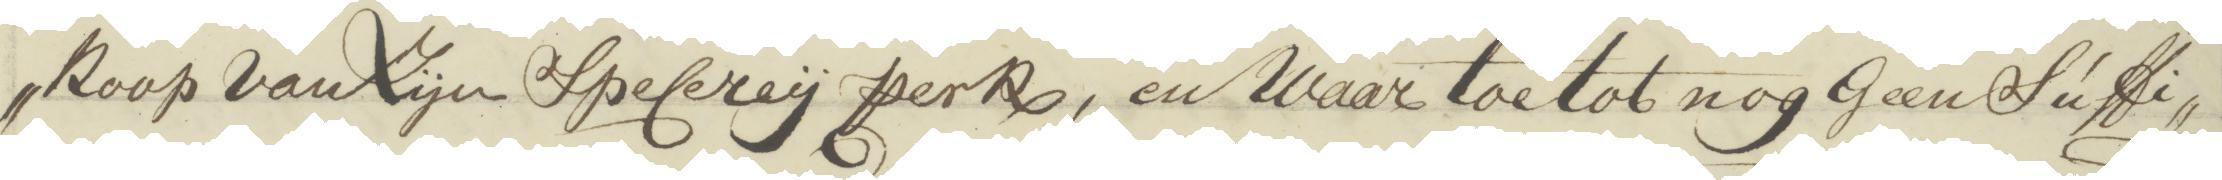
„koop van zijn specereij perk, en waar toe tot nog geen suffi„
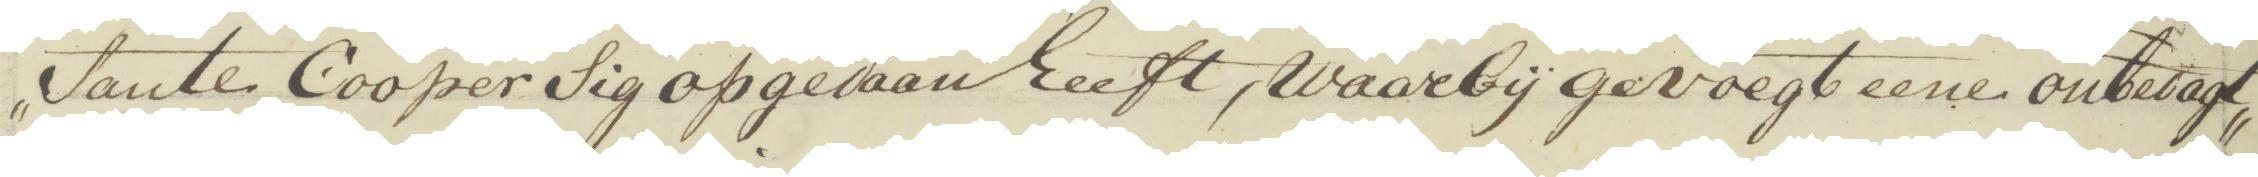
„sante Cooper sig opgedaan heeft, waarbij gevoegt eene onbedagt„
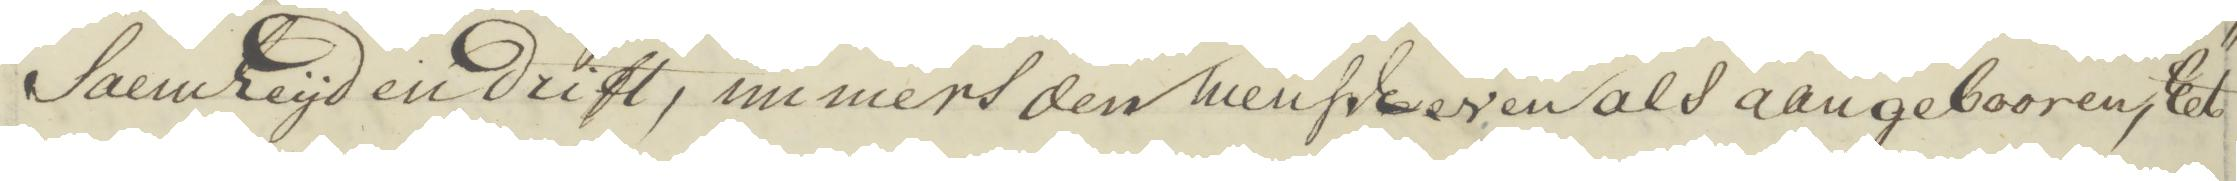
saemheijd en drift, immers den mensch even als aangebooren, het
